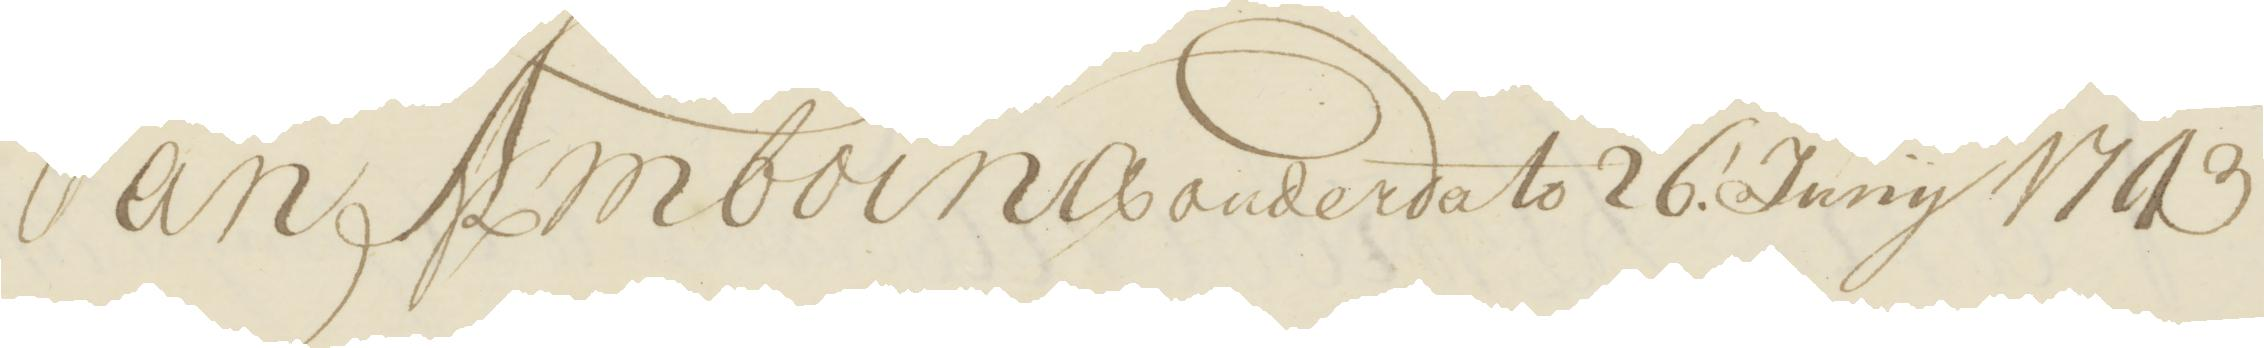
Van Amboina onder dato 26:e Junij 1743
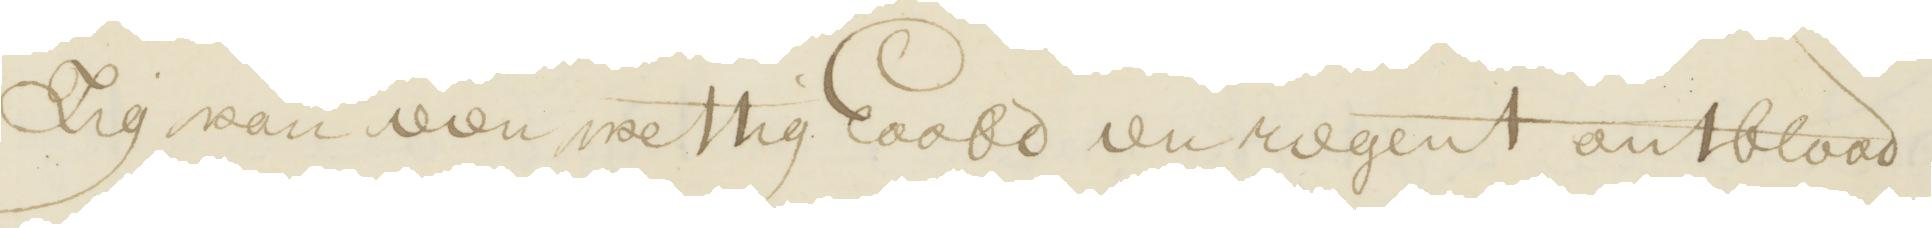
zig van een wettig hoofd en regent ontblood
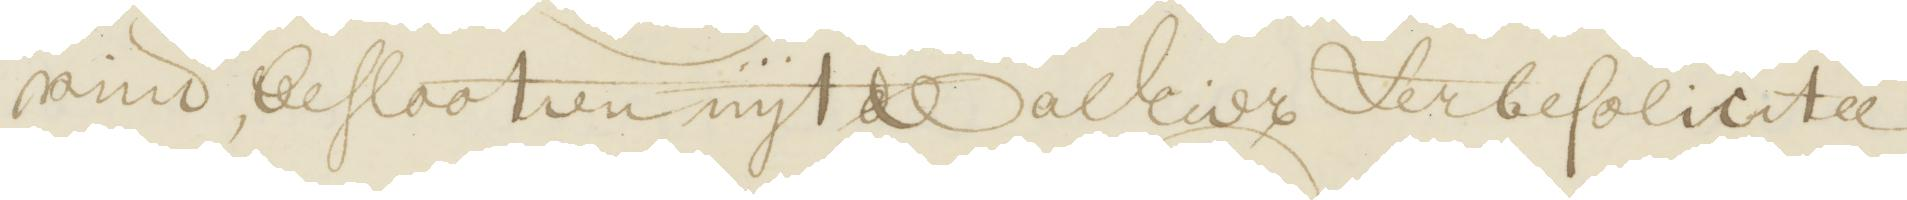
vind, beslooten uijt de alhier ter besolicitee
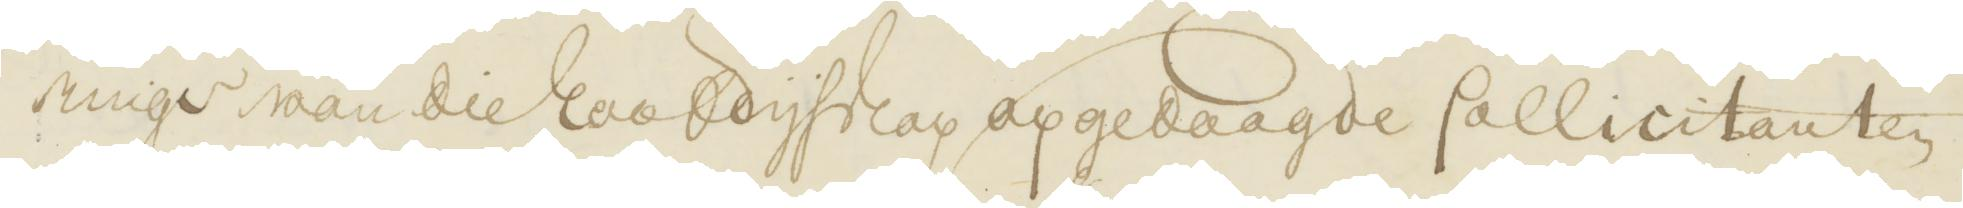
ringe van die hoofdijschap opgedaagde sollicitanten
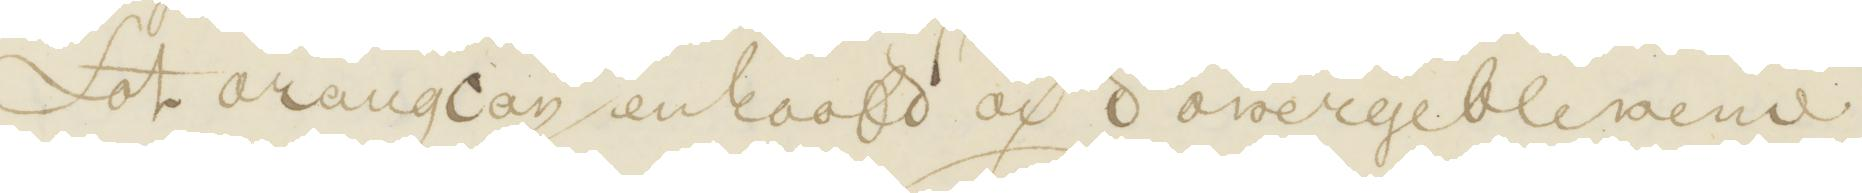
tot orangcaij en hoofd over d' overgeblevene
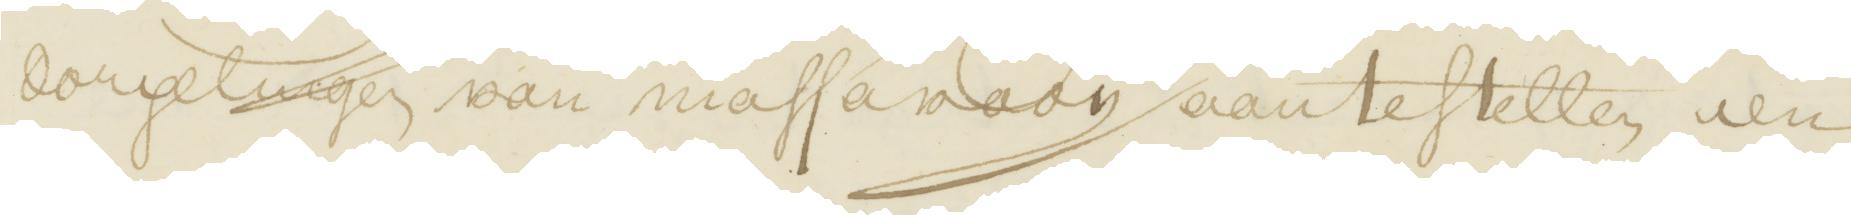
dorpelingen van massavooij aan te stellen en
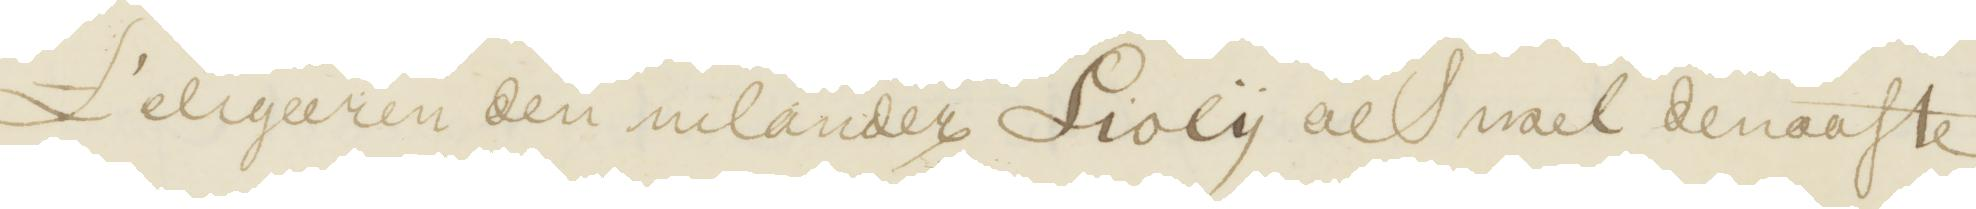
t'eligeeren den inlander Siolij als wel de naaste
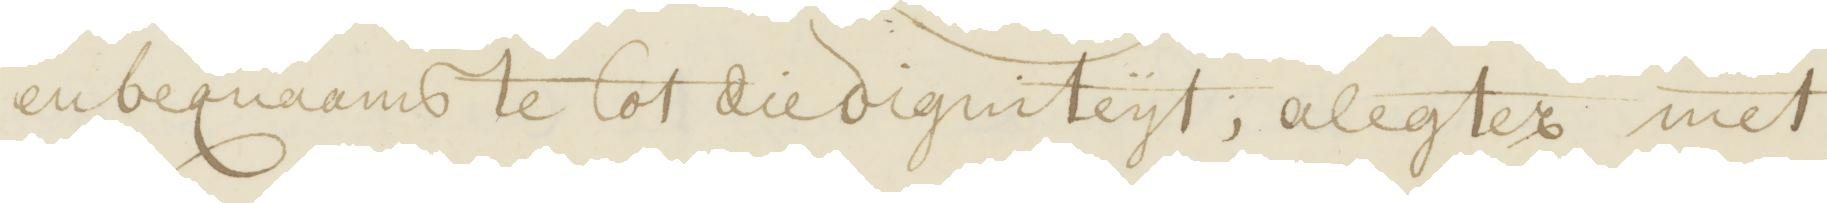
en bequaamste tot die digniteijt; alegter met
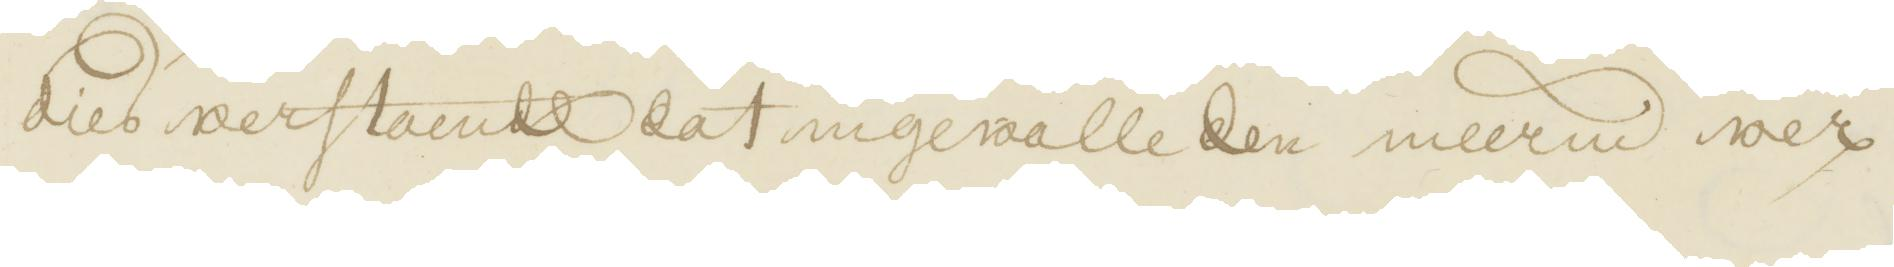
dies verstaende dat ingevalle den meerm ver
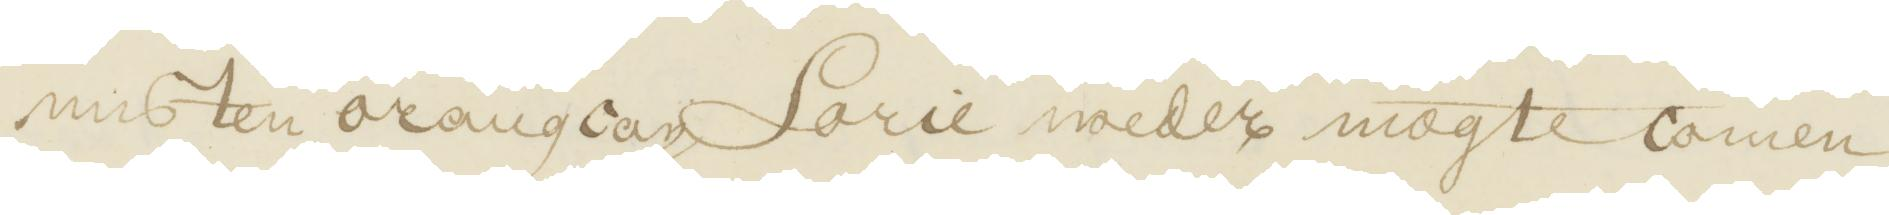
misten orangcaij Sorie weder mogte comen
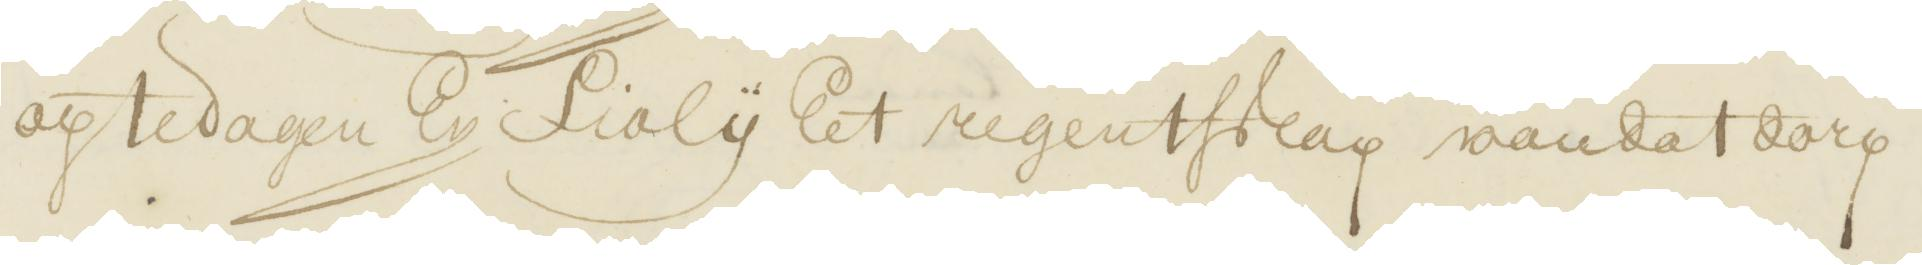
op te dagen hy Siolij het regentschap van dat dorp
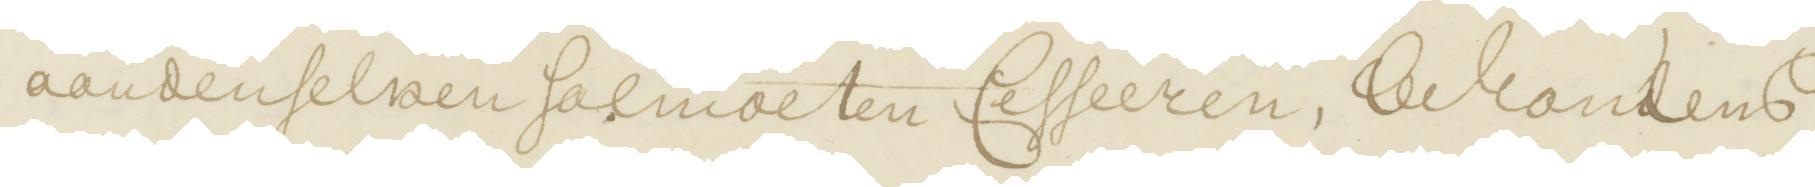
aan denselven sal moeten Cesseeren, behoudens
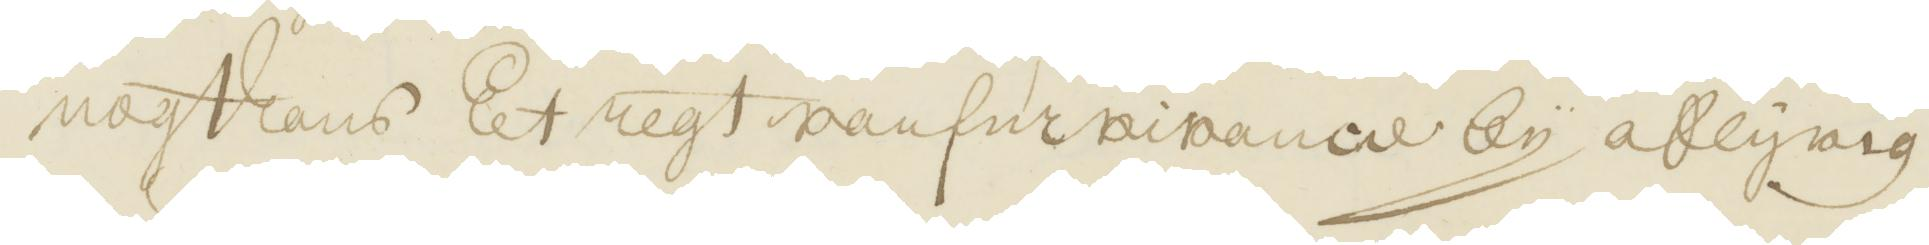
nogthans het regt van survivance bij aflijvig
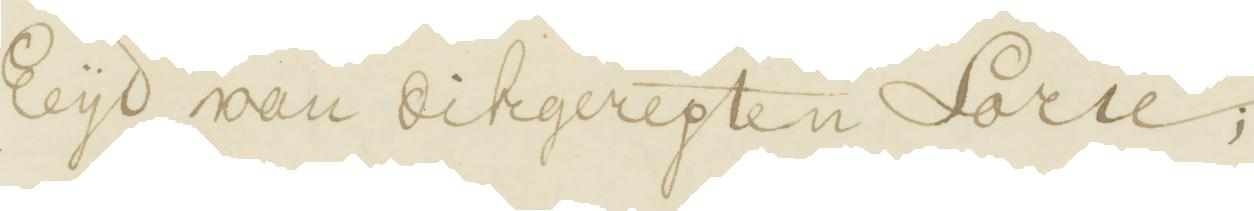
heijd van dikgerepten Sorie;
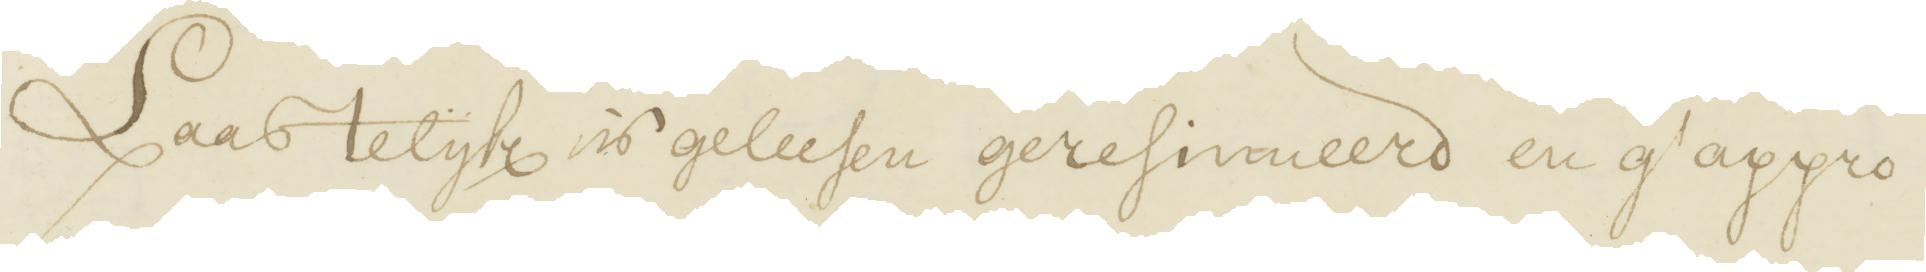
Laastelijk is geleesen geresinneerd en g’appro
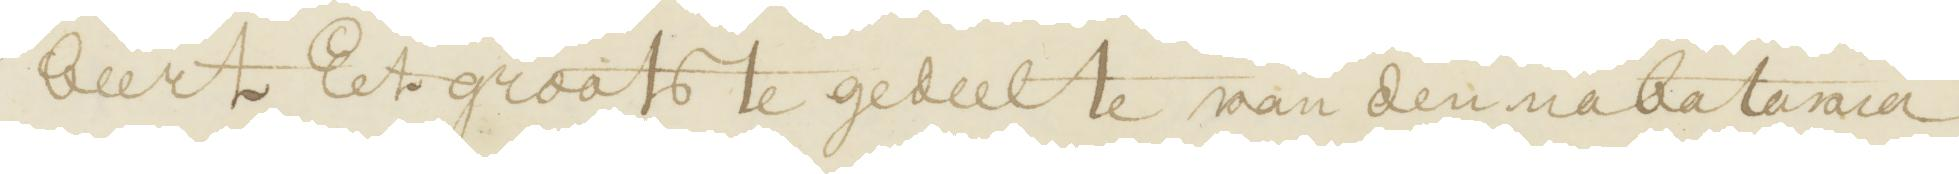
beert het grootste gedeelte van den na batavia
